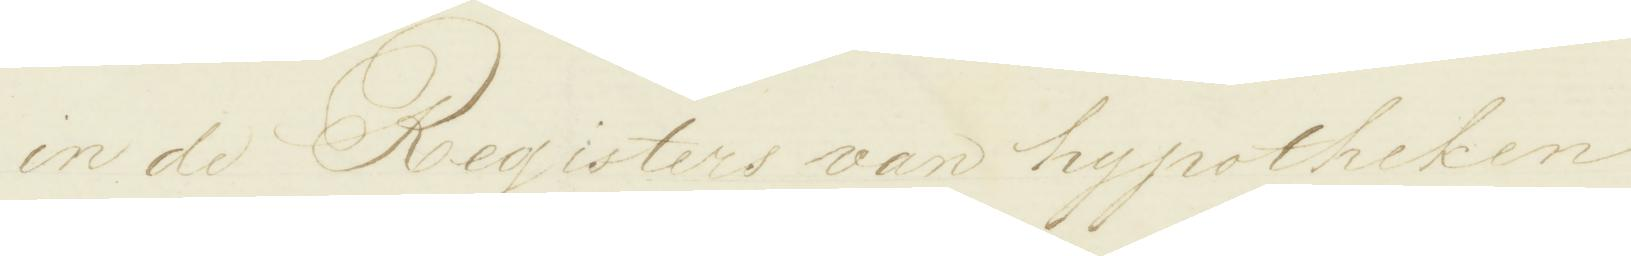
in de Registers van hypotheken
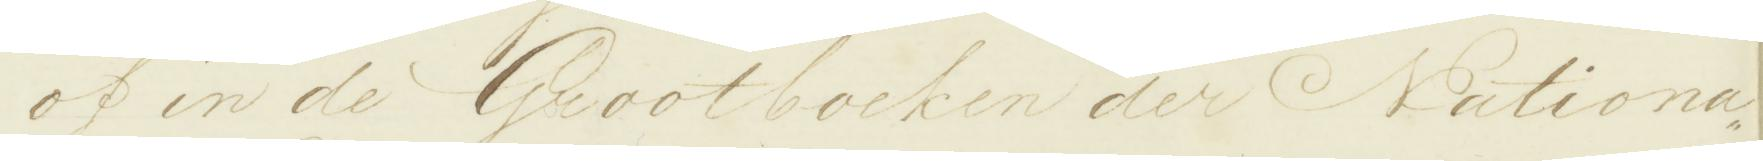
of in de Grootboeken der Nationa„
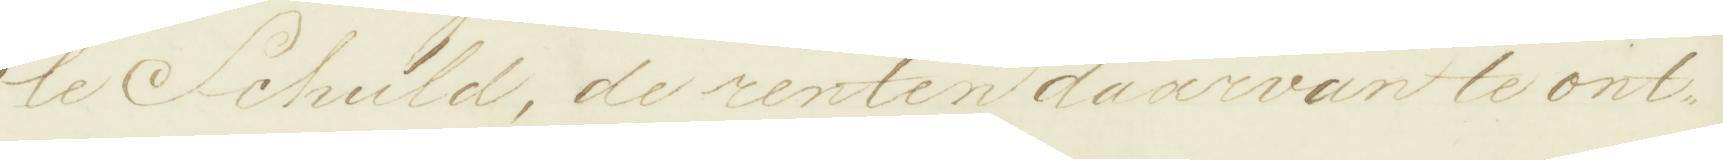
le Schuld, de renten daarvan te ont„
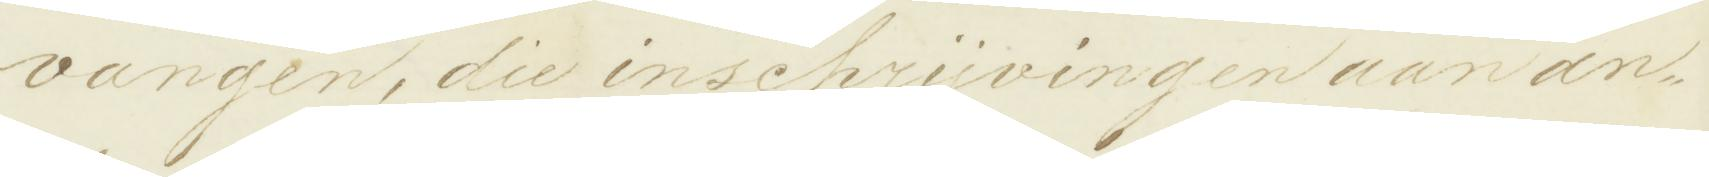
vangen, die inschrijvingen aan an„
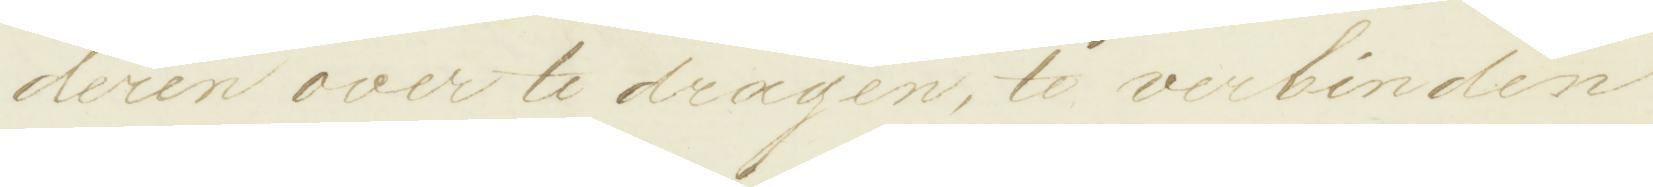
deren over te dragen, te verbinden
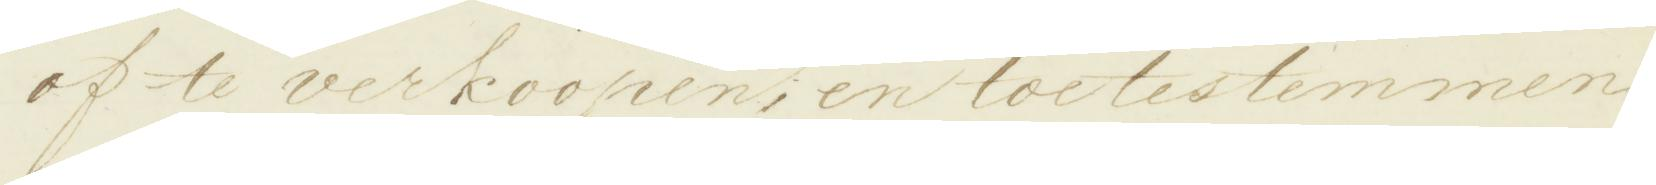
of te verkoopen, en toe te stemmen
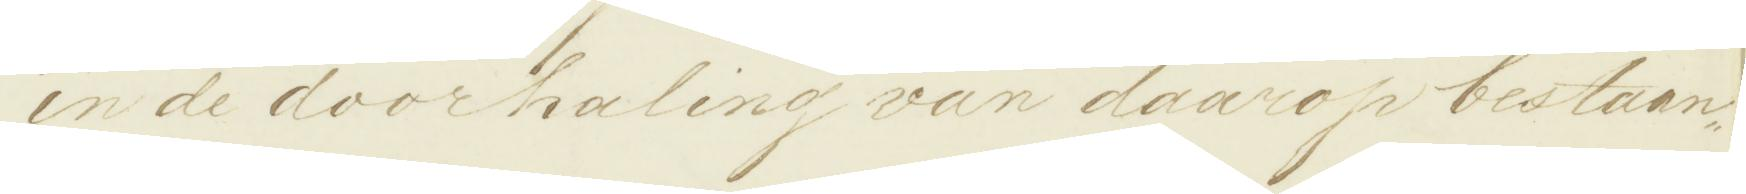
in de doorhaling van daarop bestaan„
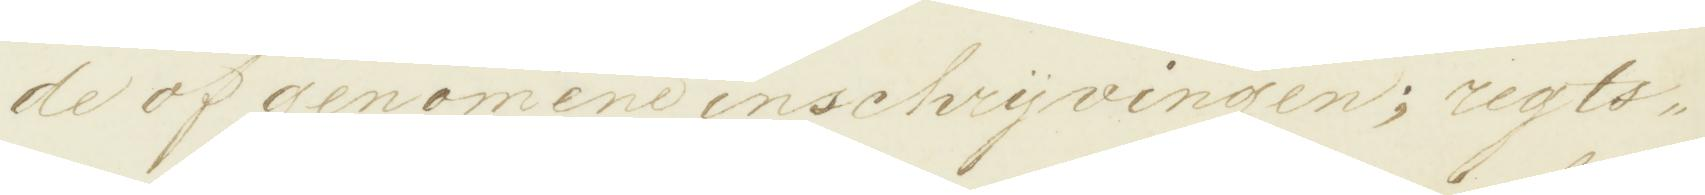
de of genomene inschrijvingen; regts„
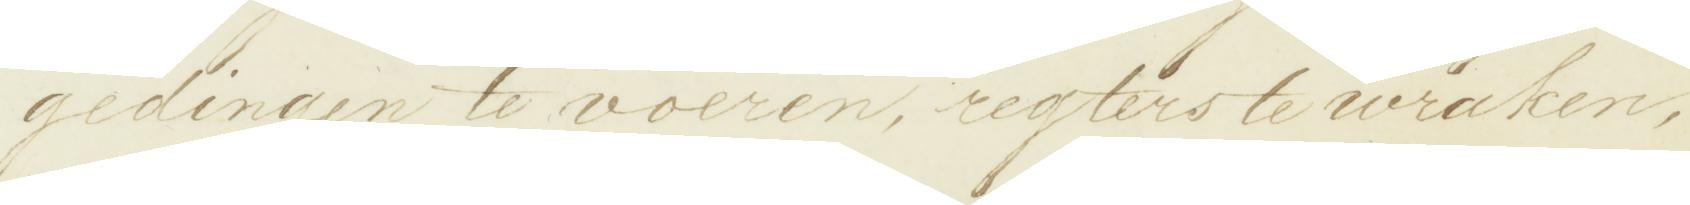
gedingen te voeren, regters te wraken,
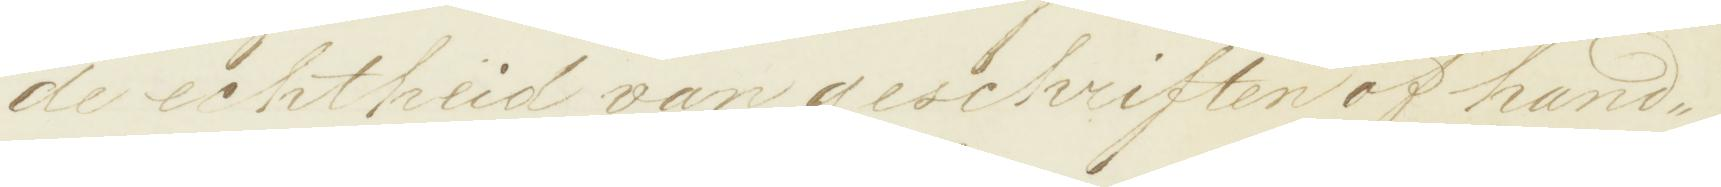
de echtheid van geschriften of hand„
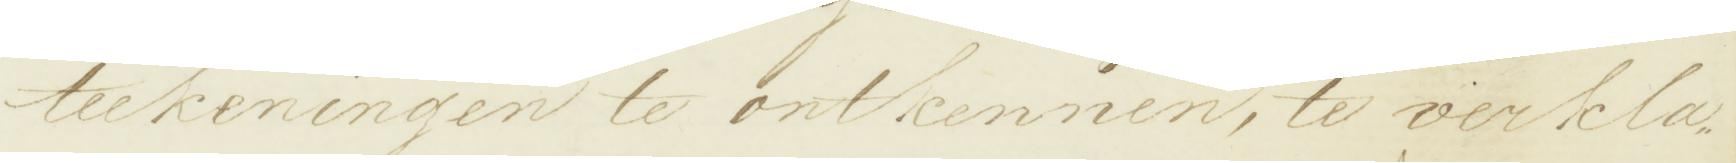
teekeningen te ontkennen, te verkla„
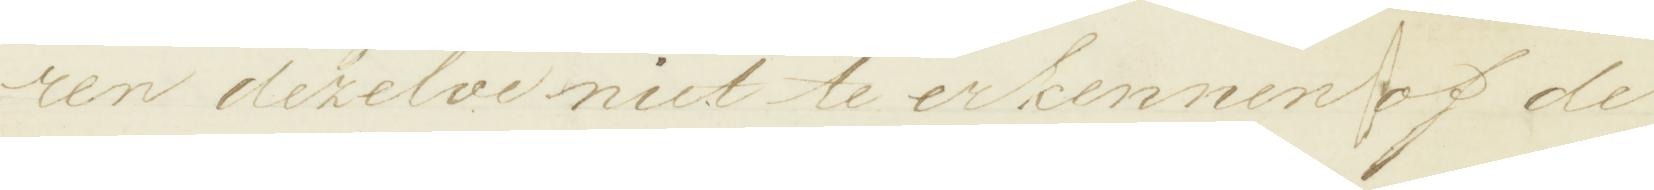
ren dezelve niet te erkennen of de
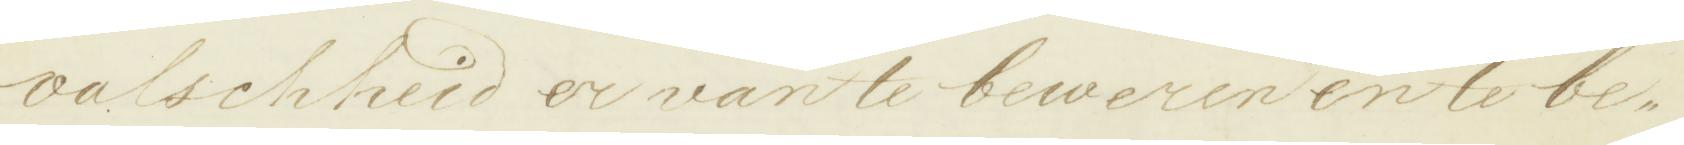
valschheid er van te beweren en te be„
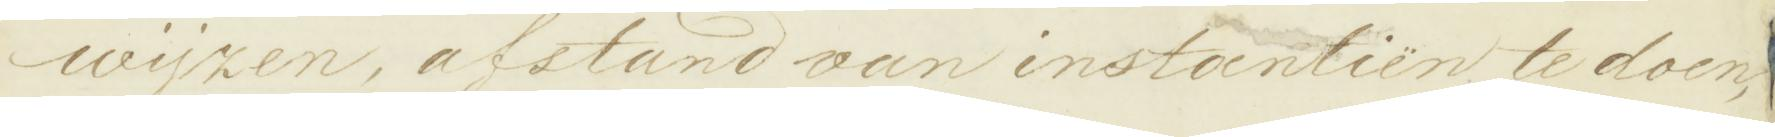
wijzen, afstand van instantiën te doen,
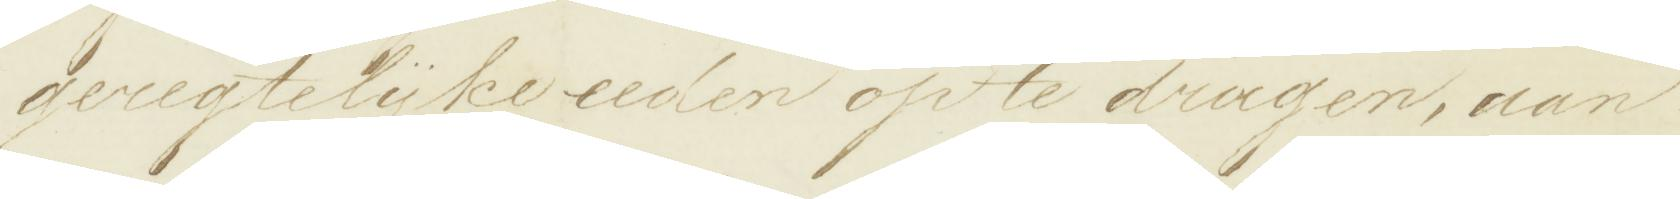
geregtelijke eeden op te dragen, aan
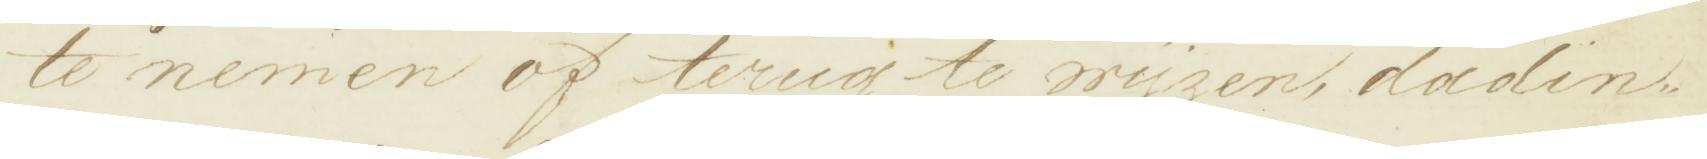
te nemen of terug te wijzen, dadin„
